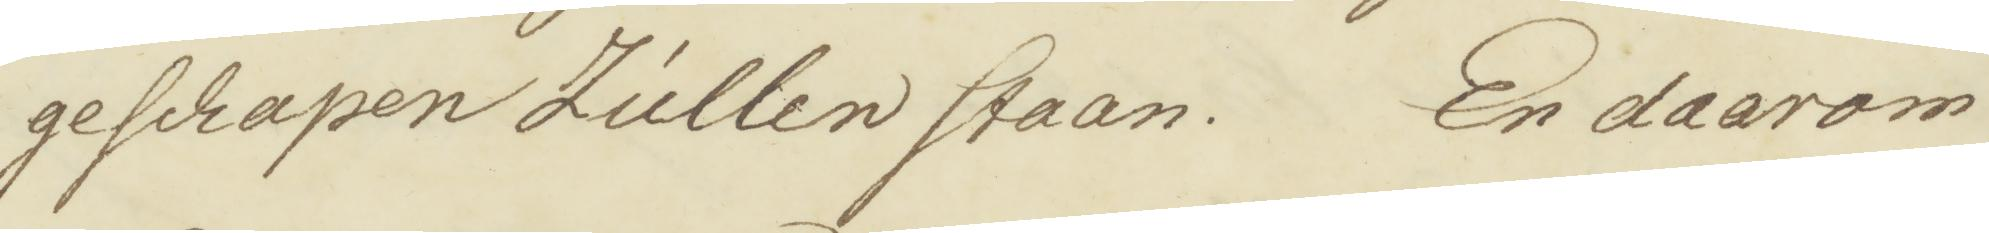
geschapen zullen staan. En daarom
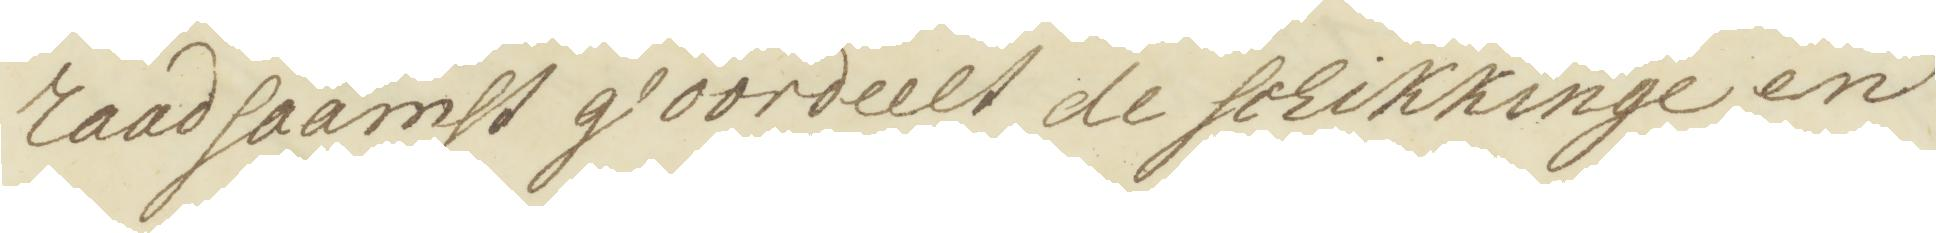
raadsaamst g’oordeelt de schikkinge en
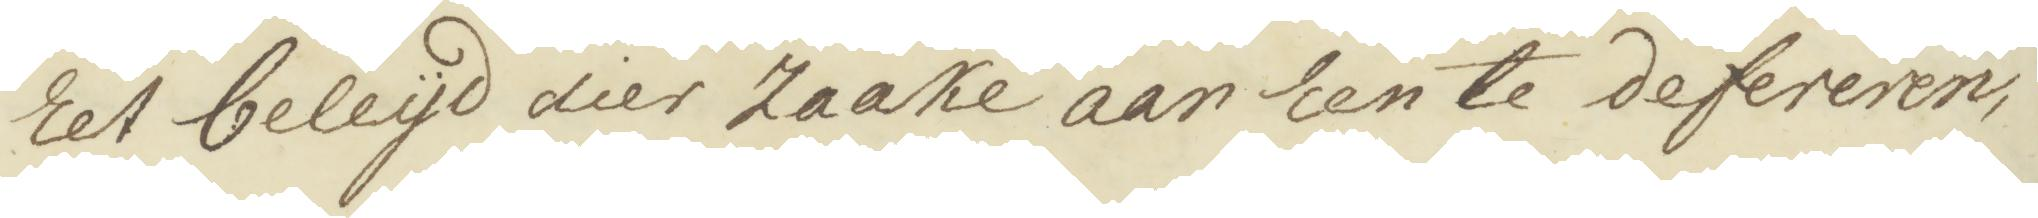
het beleijd dier zaake aan Een te defereren,
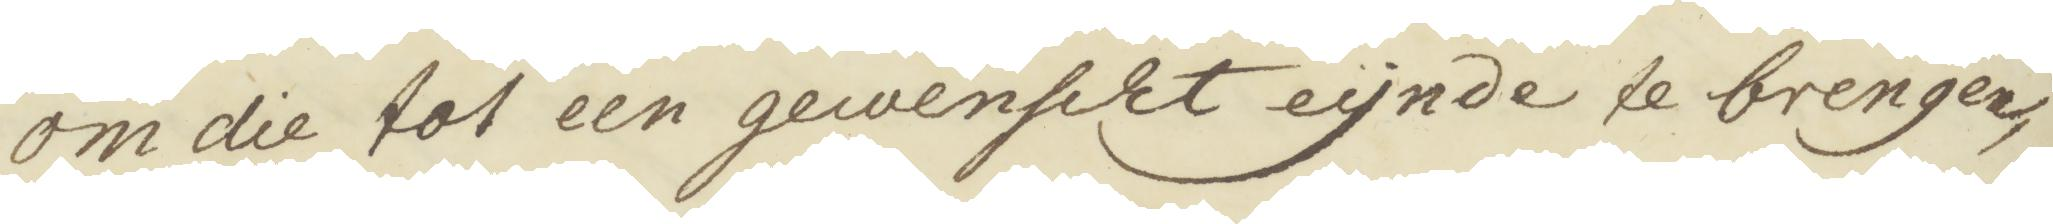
om die tot een gewenscht eijnde te brengen,
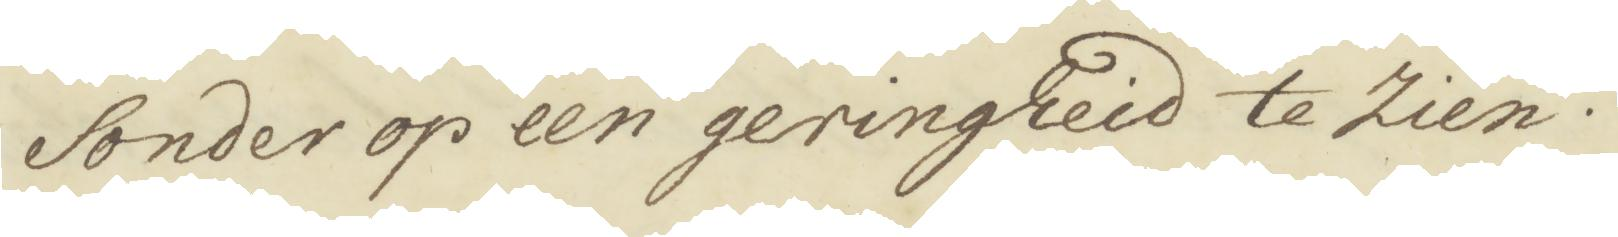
sonder op een geringheid te zien.
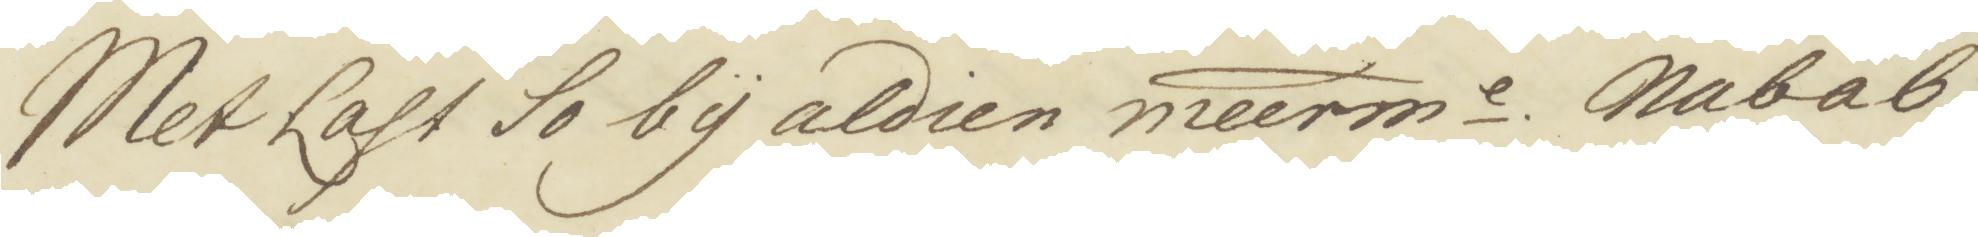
Met last so bij aldien meerm=l Nabab,
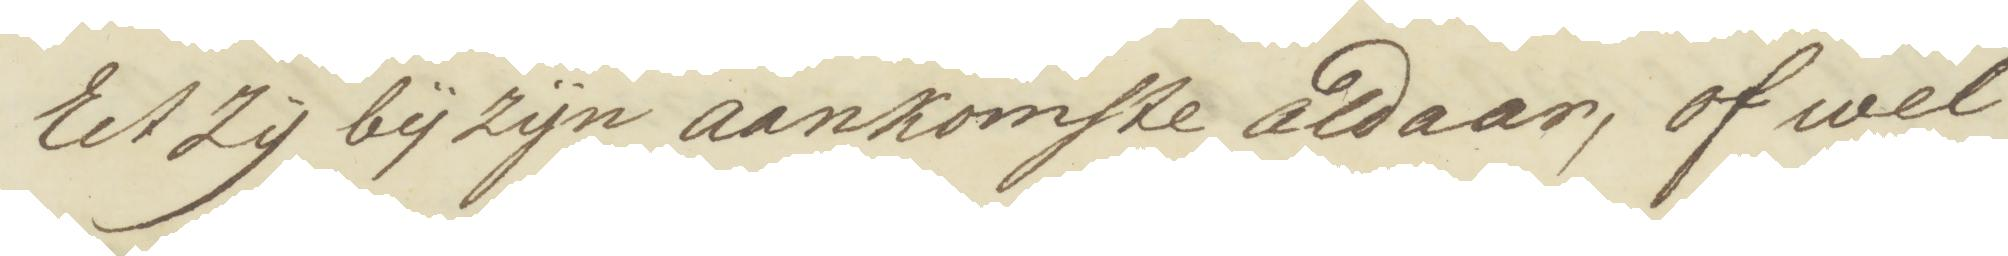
het zij bij zijn aankomste aldaar, of wel
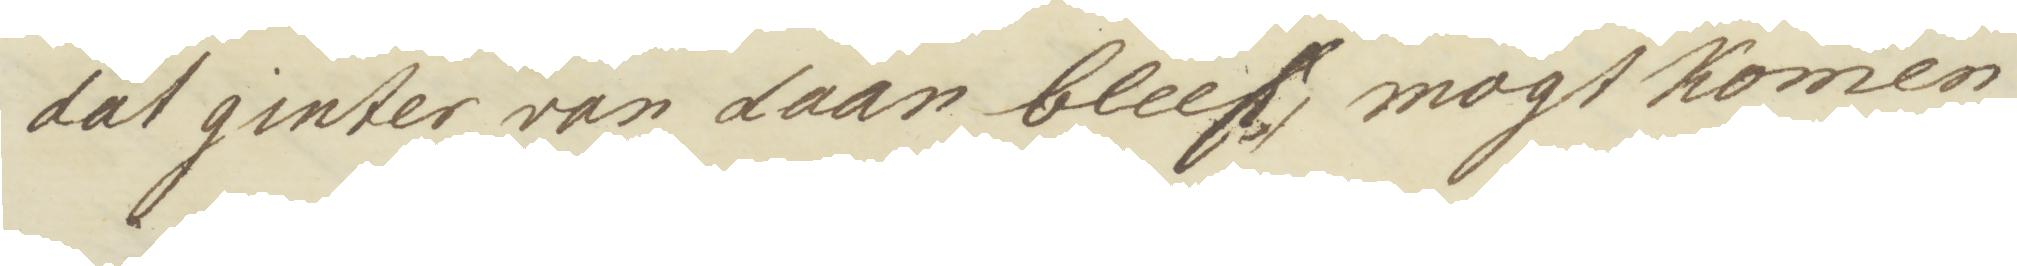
dat ginter van daar bleef, mogt komen
